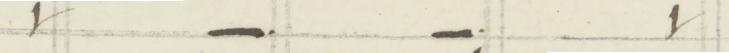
1 —. —. 1
